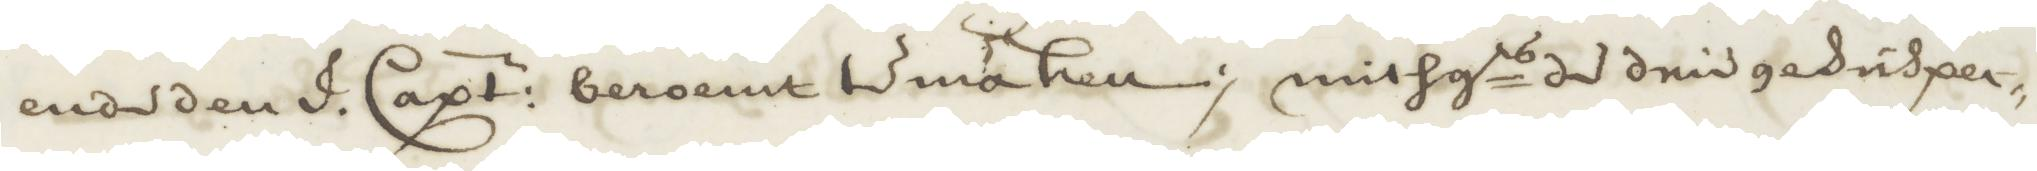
ende den E. Capt:n beroemt te maken; mitsg=rs de drie gesuspec„
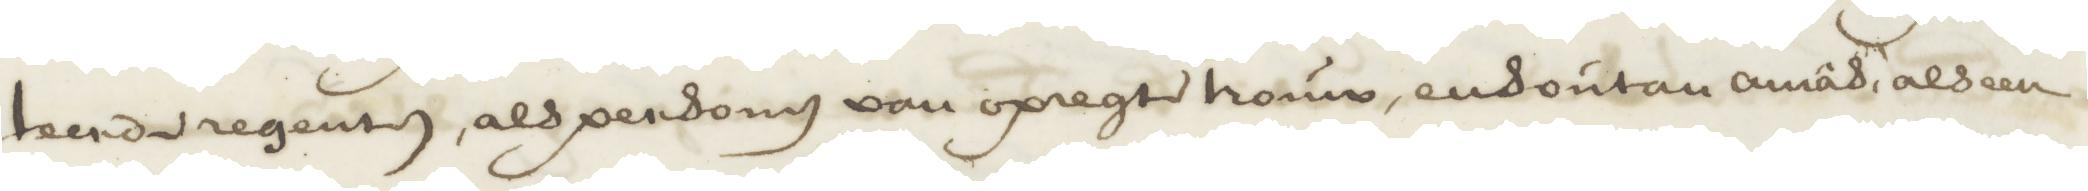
teerde regenten, als personen van opregte trouw, en soutan amas, als een
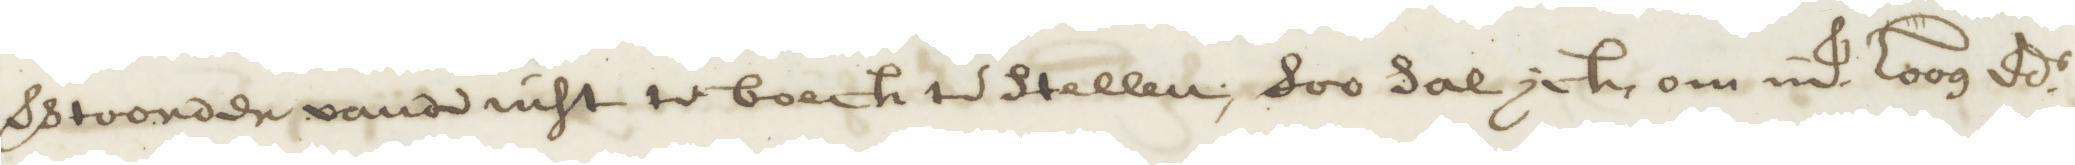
verstoorder vande rust te boeck te stellen; soo sal jck, om uE: hoog Ed.s
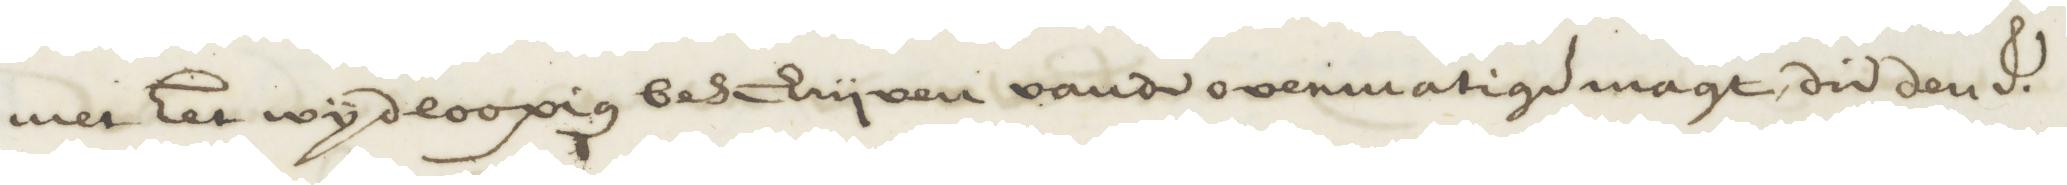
met het wijdloopig beschrijven vande overmatige magt, die den E.
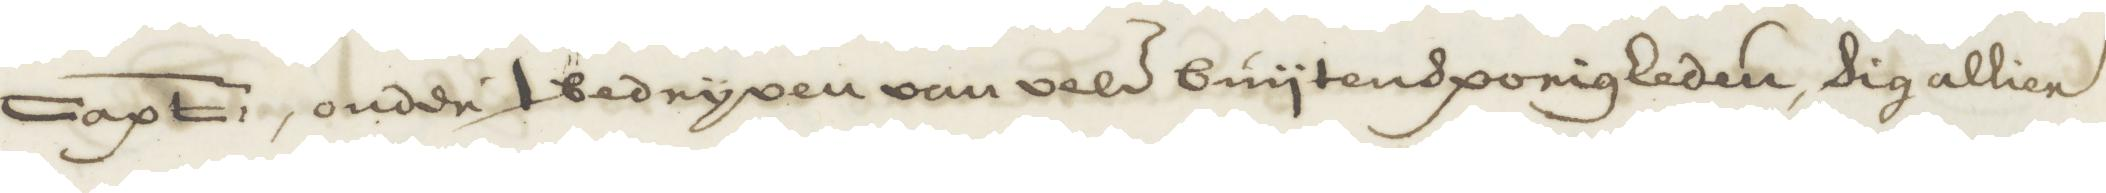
Capt:n, onder ’t bedrijven van vele buijtensporigheden, sig alhier
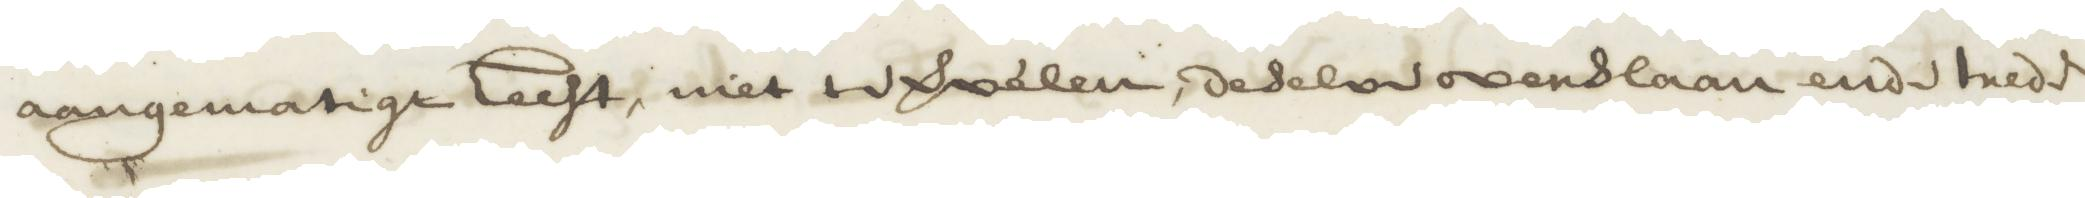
aangematigt heeft, niet te vervelen, deselve overslaan ende treden
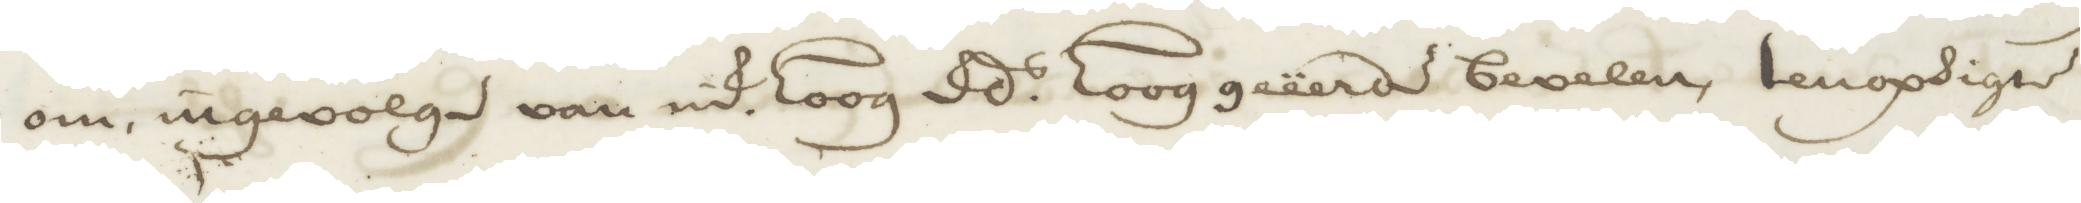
om, ingevolge van uE: hoog Ed:s hoog geëerde bevelen, ten opsigte
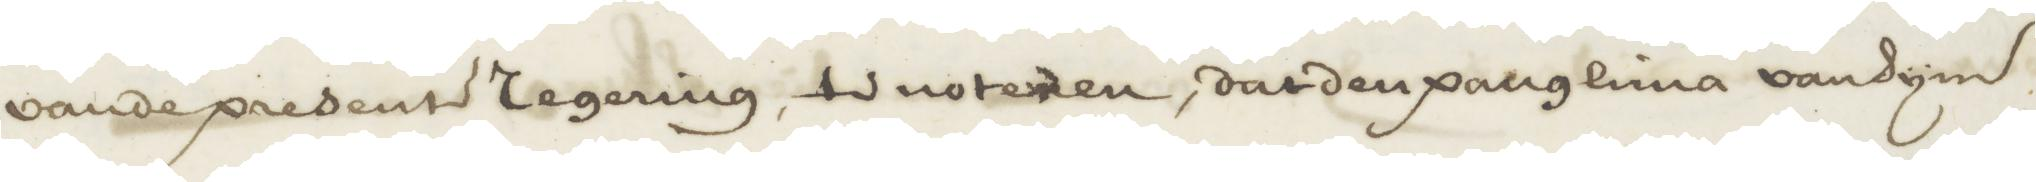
vande presents regering, te noteren, dat den panglima van sijne
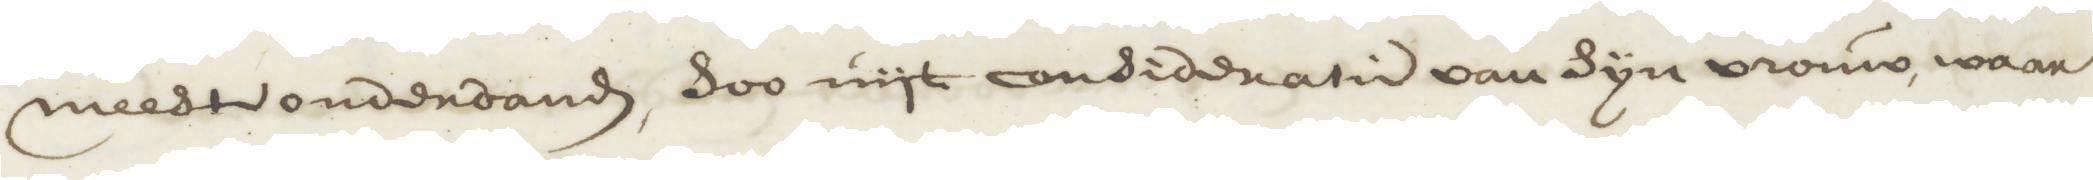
meeste onderdanen, soo uijt consideratie van sijn vrouw, waar
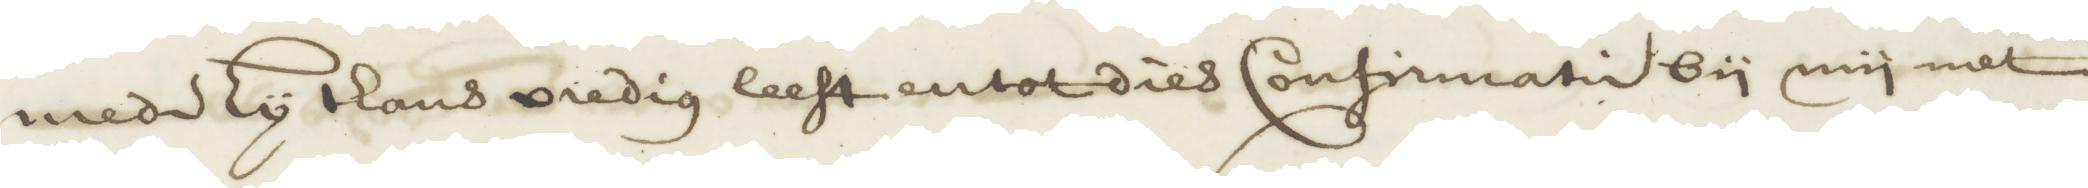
mede hij thans vredig leeft en tot dies Confirnatie bij mij met
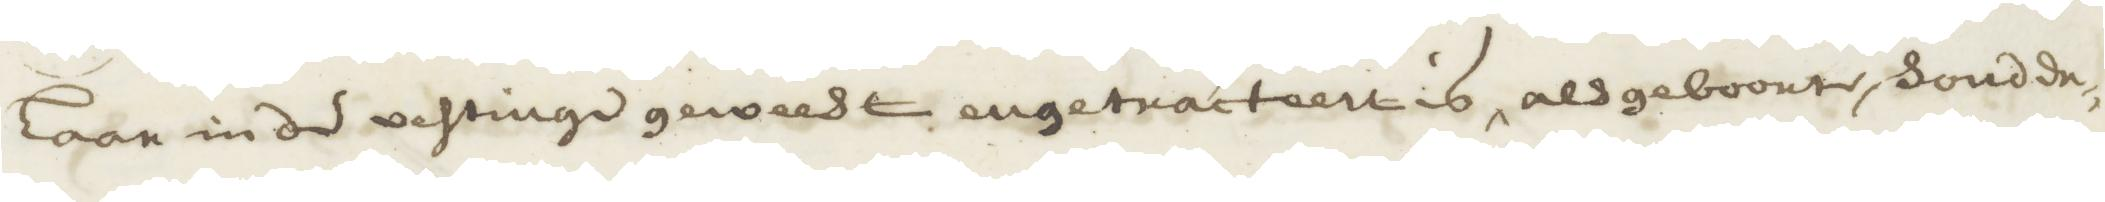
haar in de vestinge geweest en getracteert is, als geboorte, sonder„
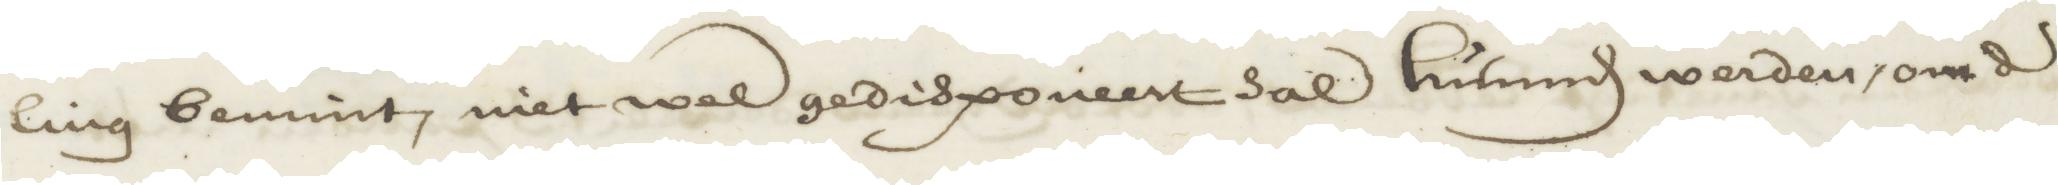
ling bemint, niet wel gedisponeert sal kunnen werden, om de
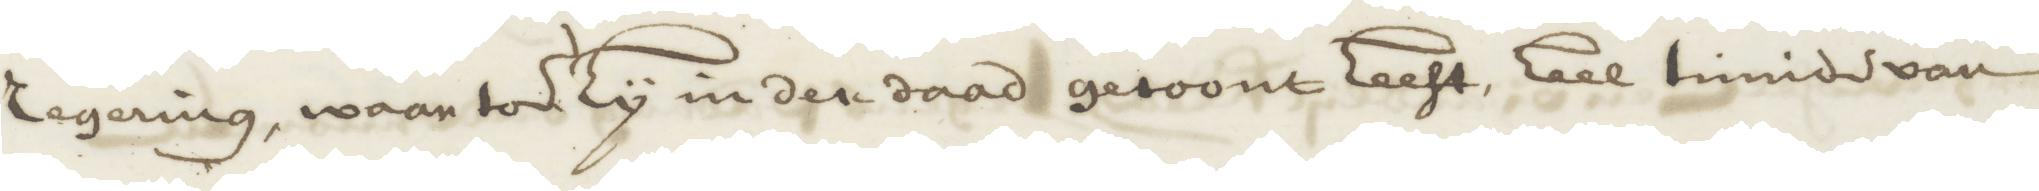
regering, waar toe hij in der daad getoont heeft, heel timide van
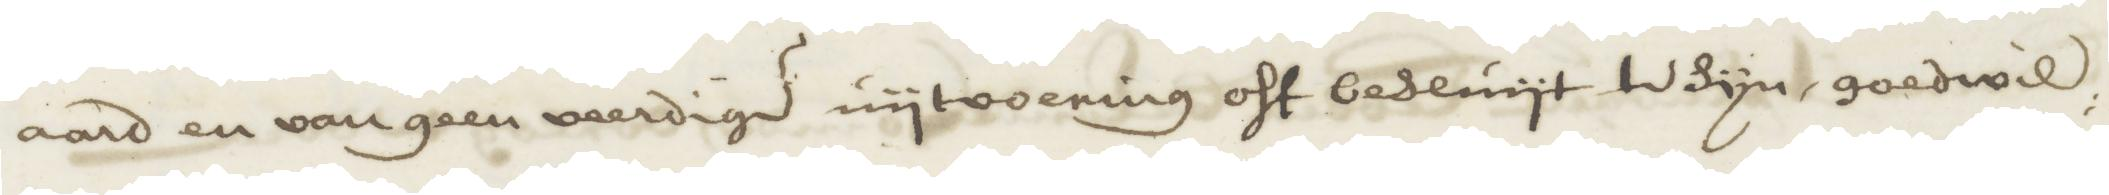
aard en van geen vaardige uijtvoering off besluijt te sijn, goedwil„
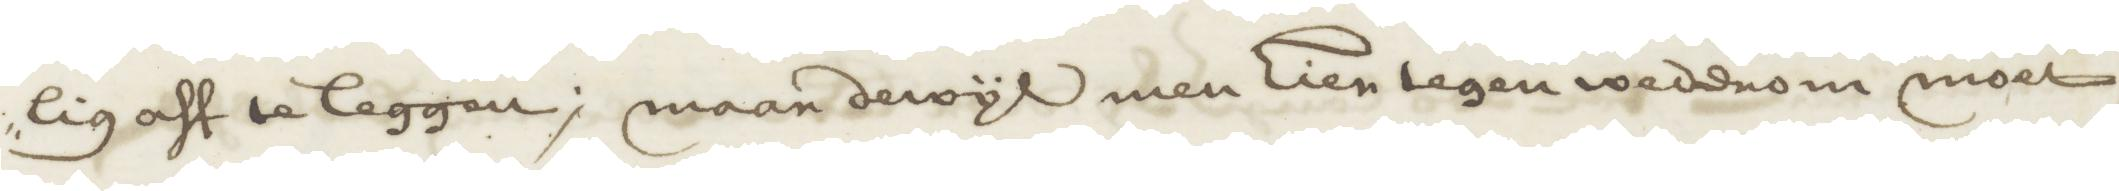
„lig aff te leggen; maar dewijl men hier tegen wederom moet
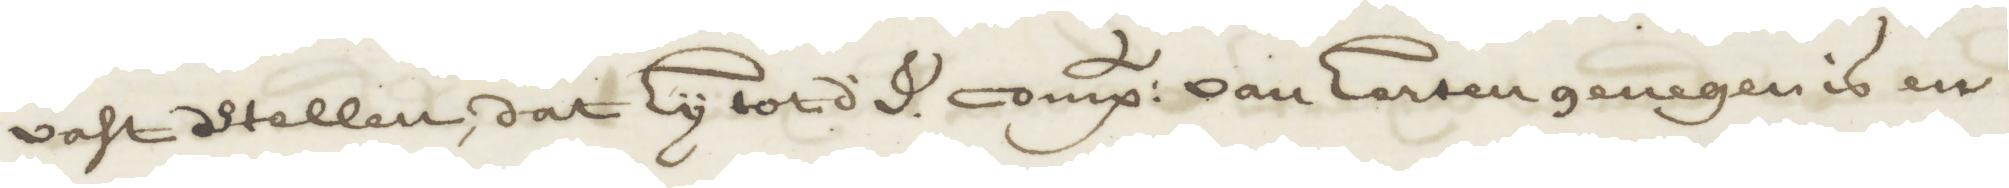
vast stellen, dat hij tot d’ E: comp: van harten genegen is en
